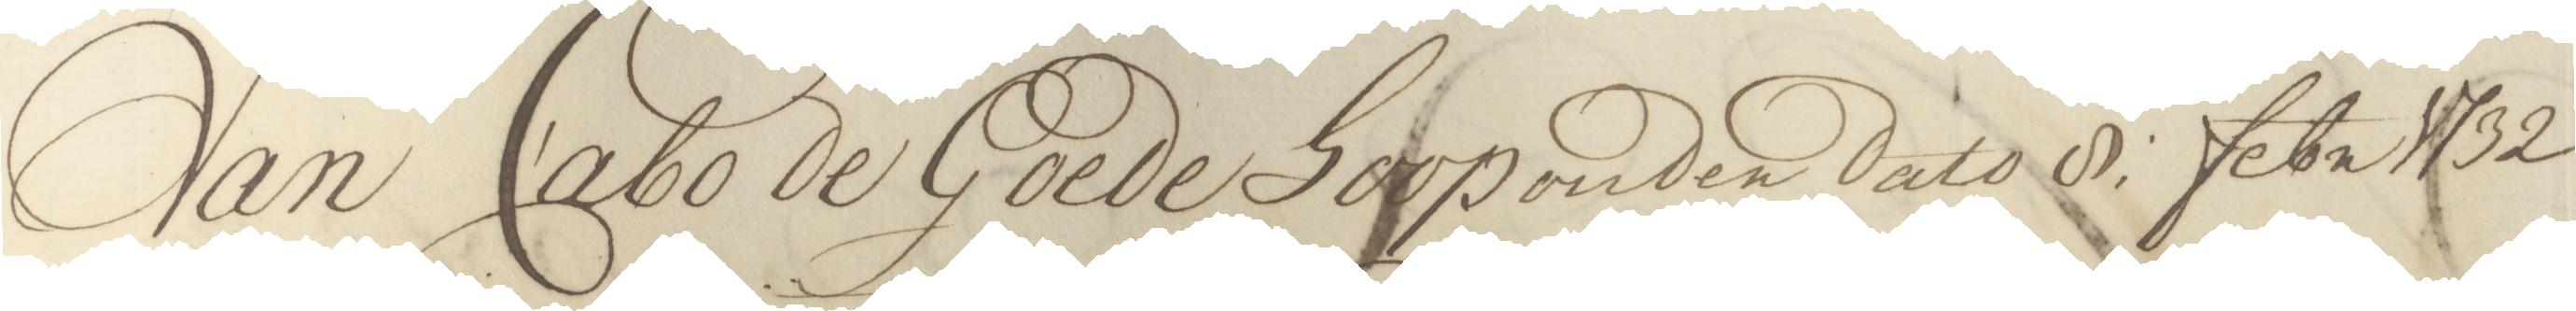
Van Cabo de Goede Hoop onder dato 8:' febr 1732
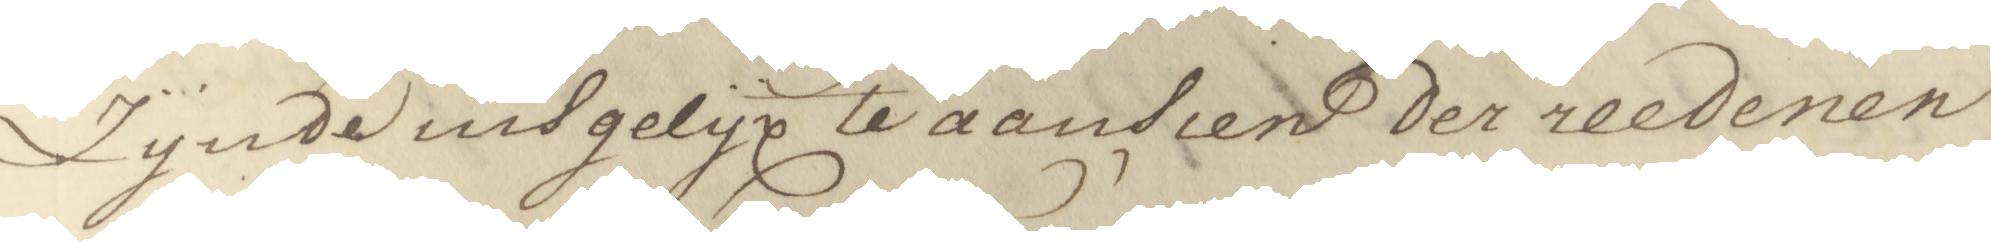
zijnde insgelijx te aansien der reedenen
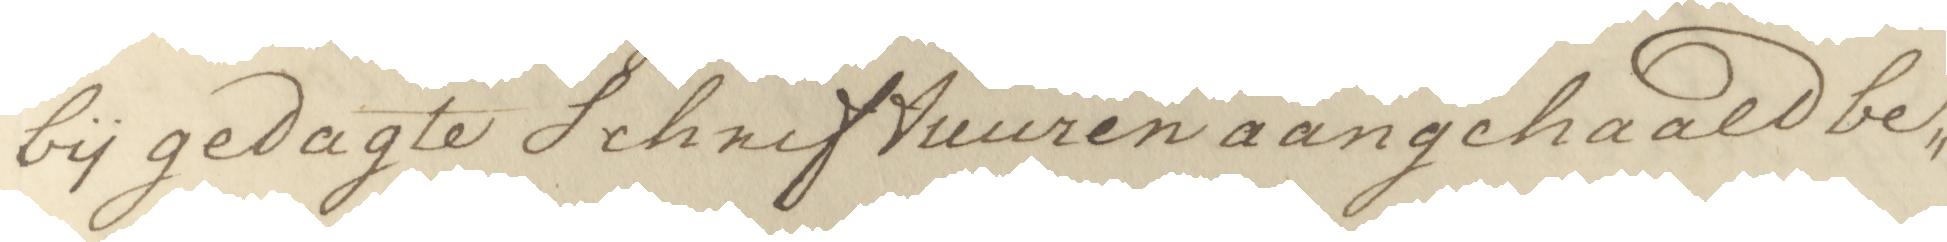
bij gedagte schriftuuren aangehaald be„
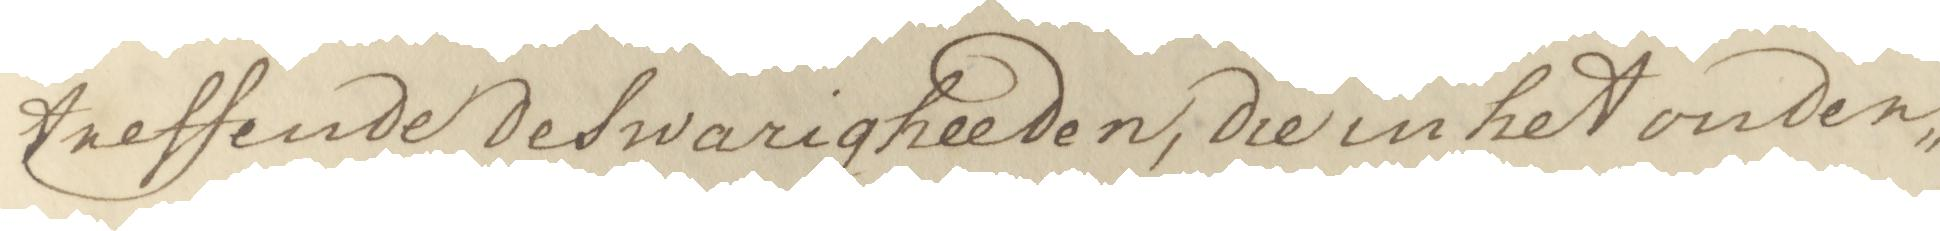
treffende deswarigheeden, die in het onder„
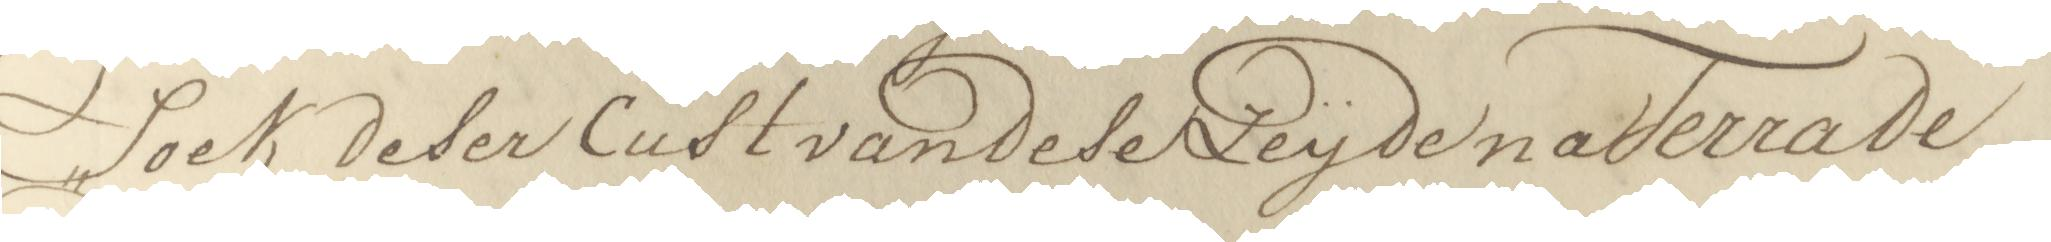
„soek deser Cust van dese zeijde na Terrade
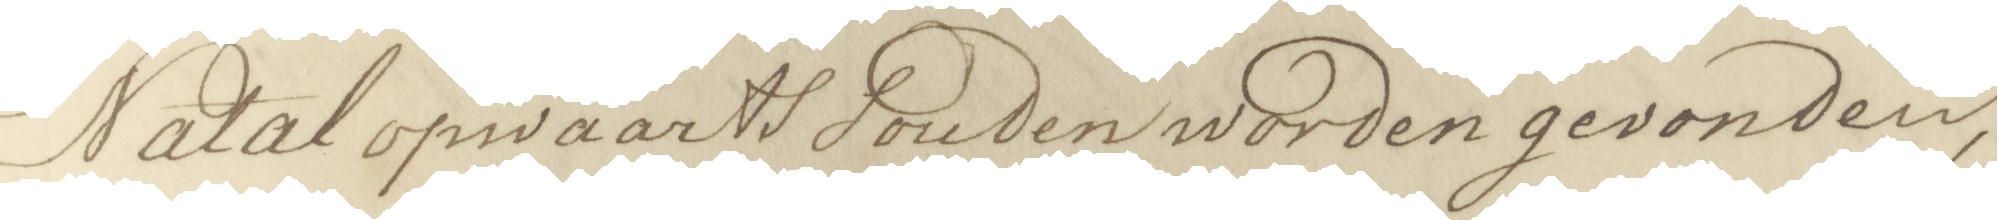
Natal opwaarts souden worden gevonden,
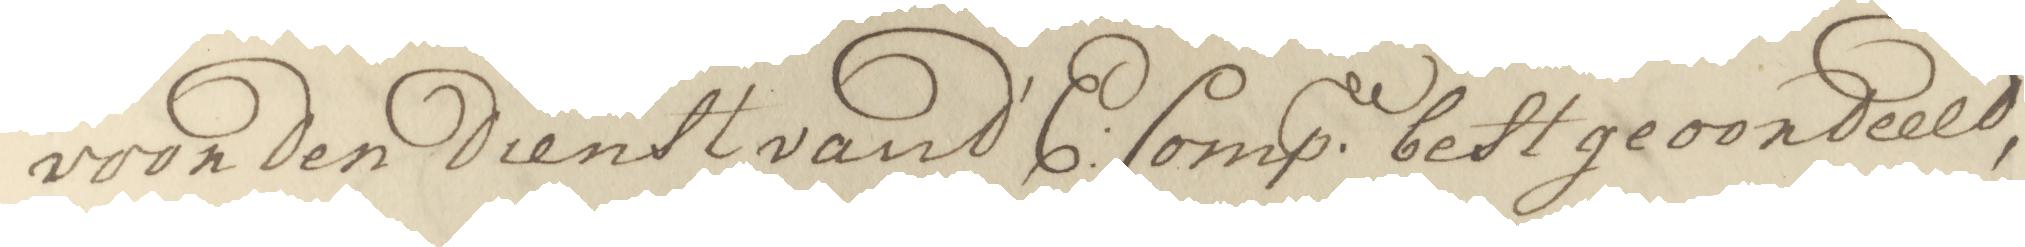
voor den dienst van d’E: Comp.e best geoordeeld,
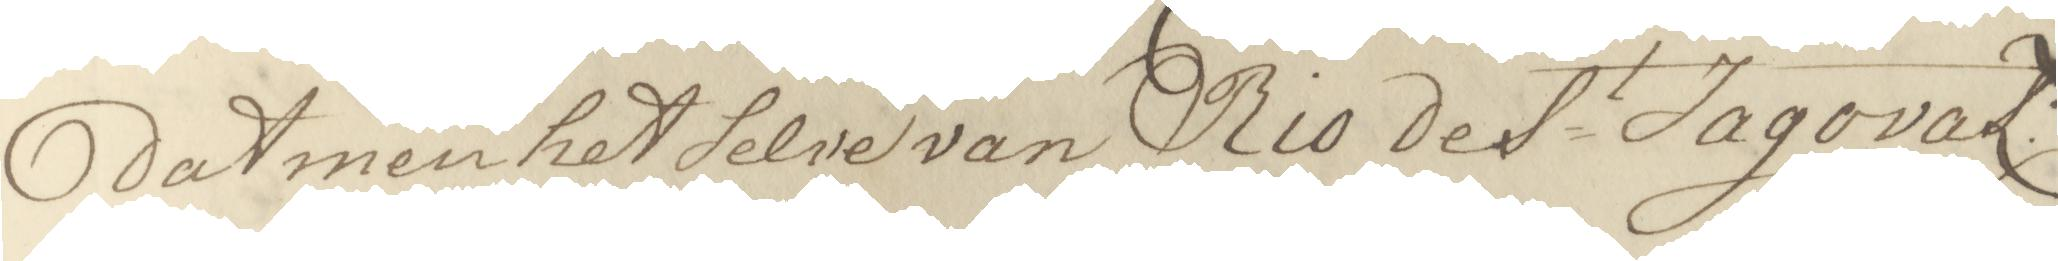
dat men het selve van Rio de s=t Iagovaz:
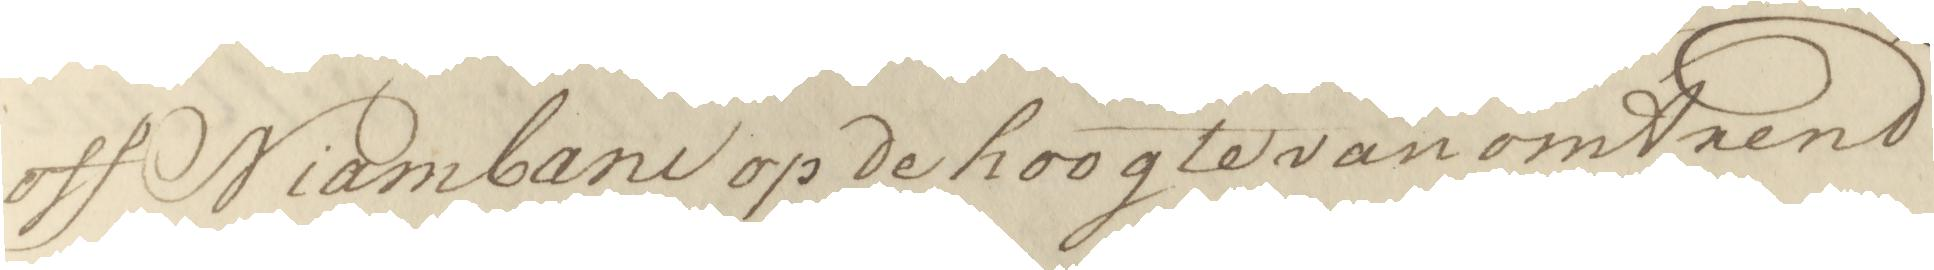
off Niambani op de hoogte van omtrend
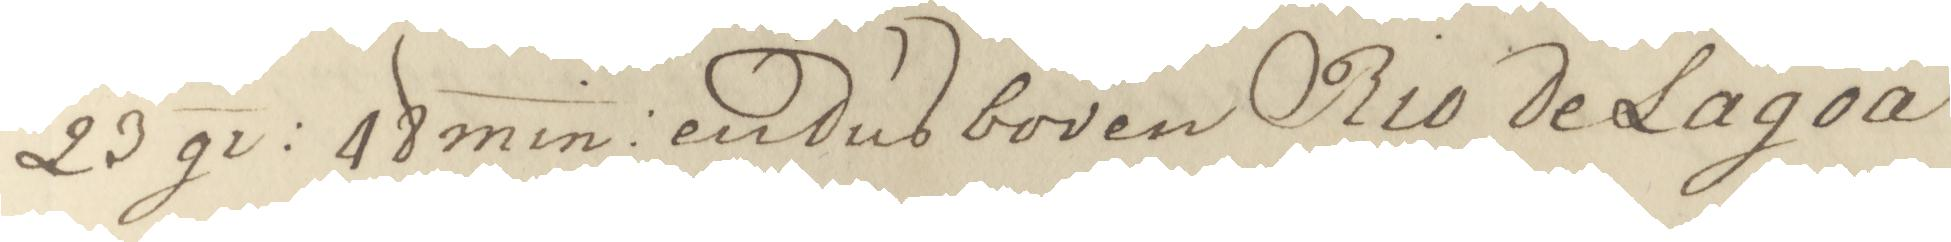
23 gr: 48 min: en dus boven Rio de Lagoa
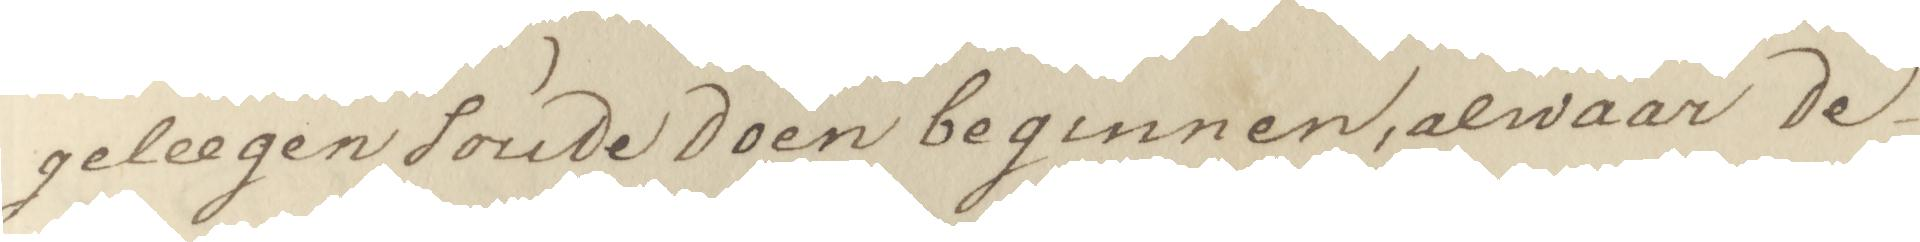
geleegen soude doen beginnen, alwaar de
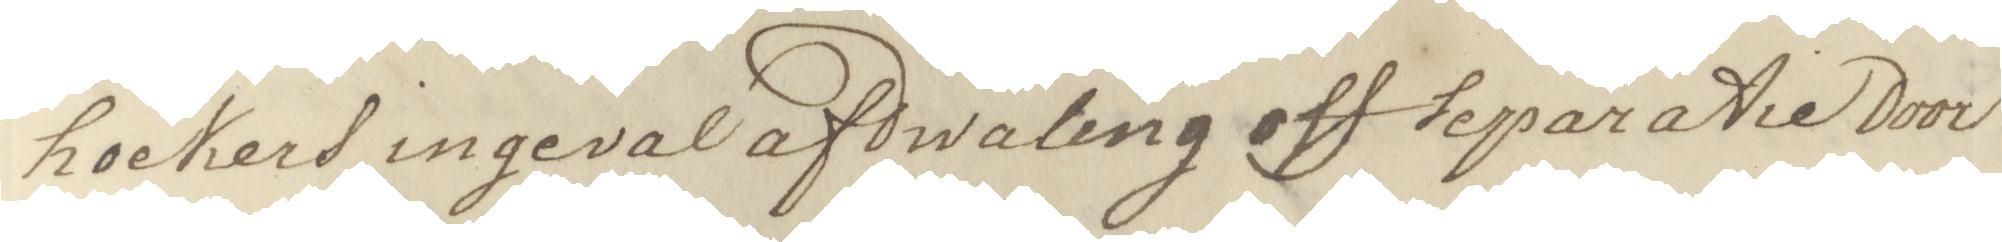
hoekers ingeval afdwaling off separatie door
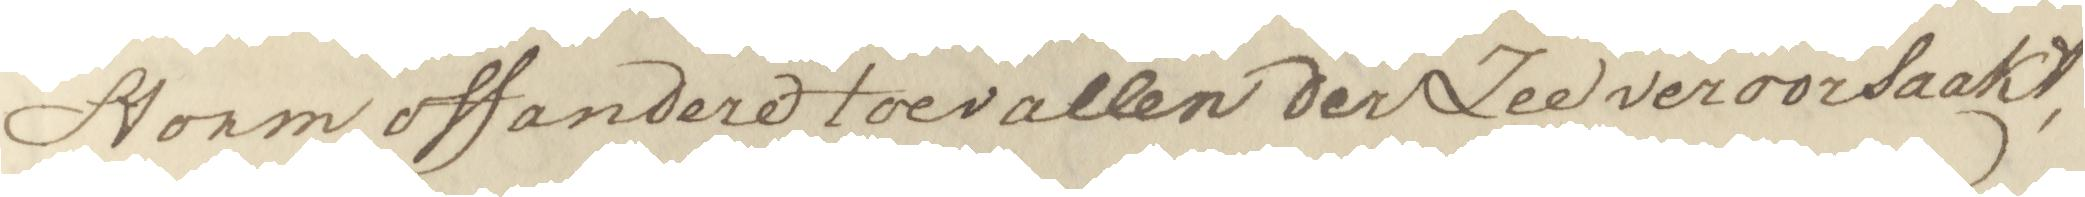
storm off andere toevallen der zee veroorsaakt,
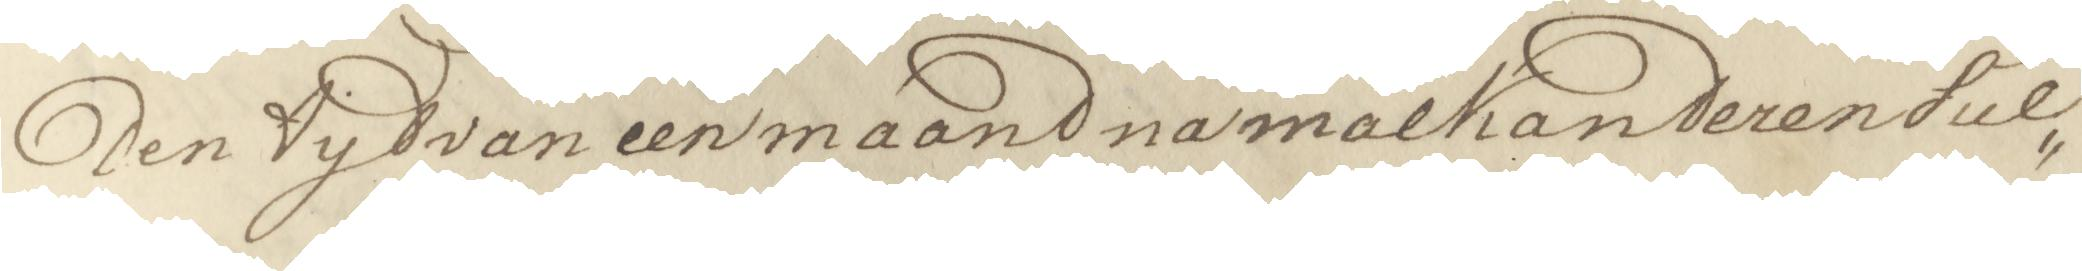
den tijd van een maand na malkanderen sul„
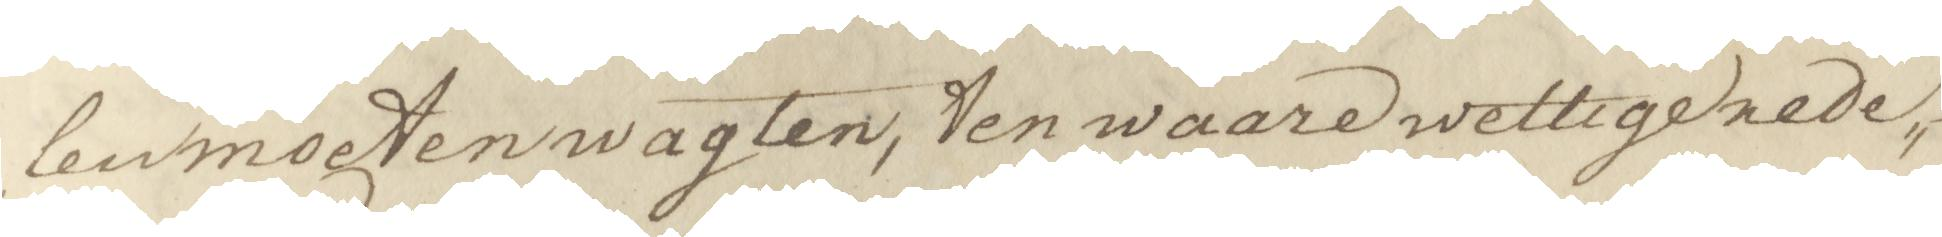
„len moeten wagten, ten waare wettige rede„
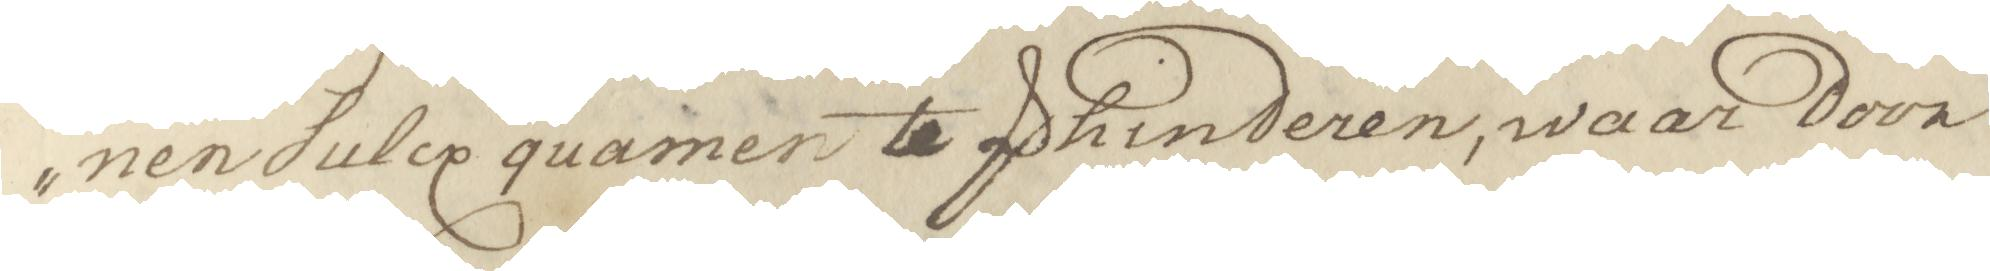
„nen sulcx quamen te verhinderen, waar door
